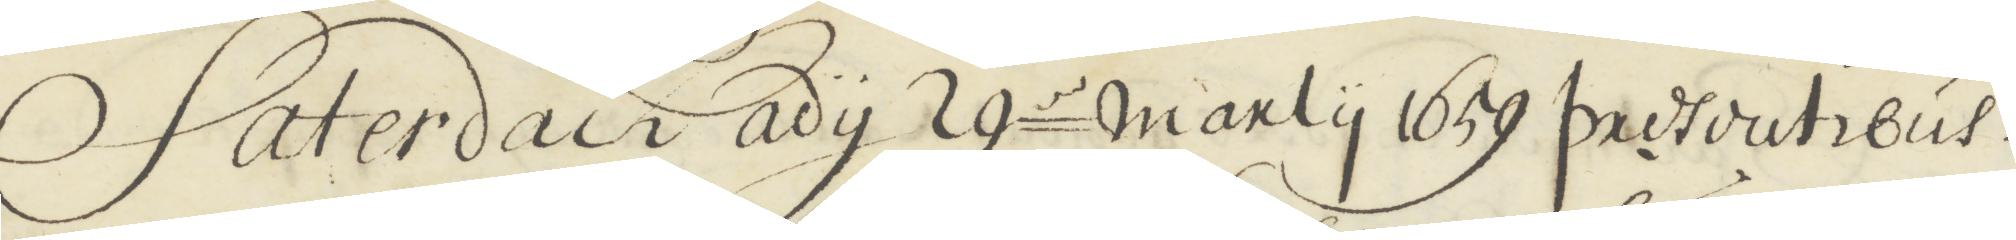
Saterdach adij 29=e Martij 1659 Presentibus —
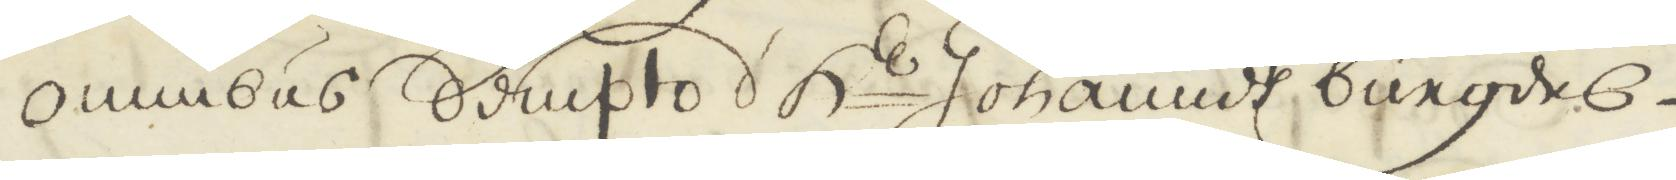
omnibus dempto d H=r Johannes burgers
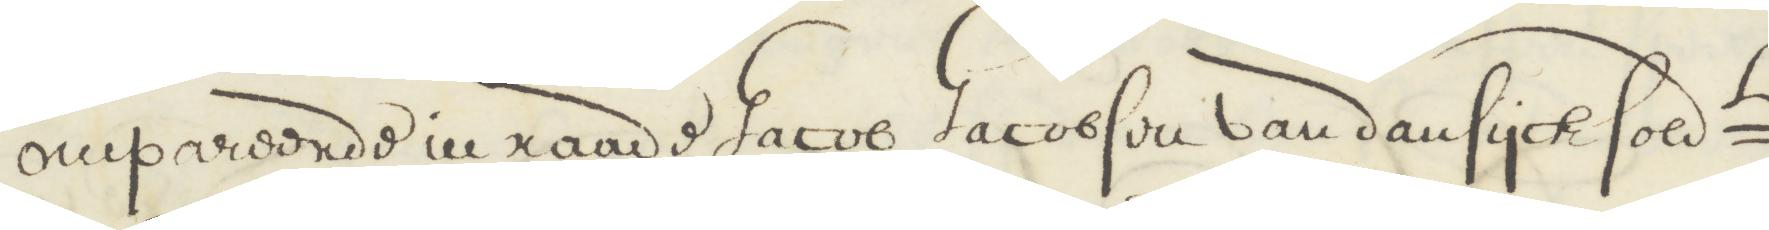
Compareerde in raade Iacob Jacobsen van dansijck sold=t
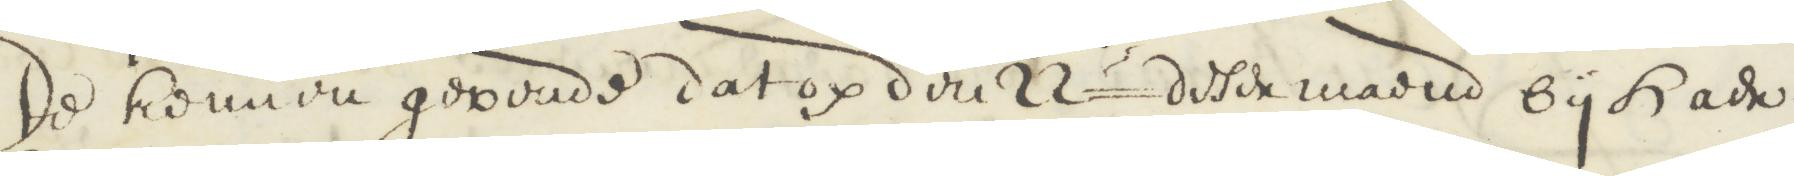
te kennen gevende dat op den 22= deser maend bij Haer
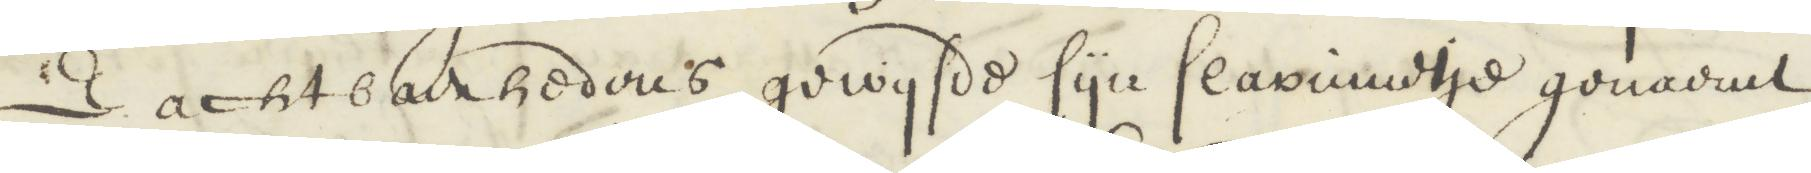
E achtbaerhedens gewijsde sijn slavinnetje genaemt
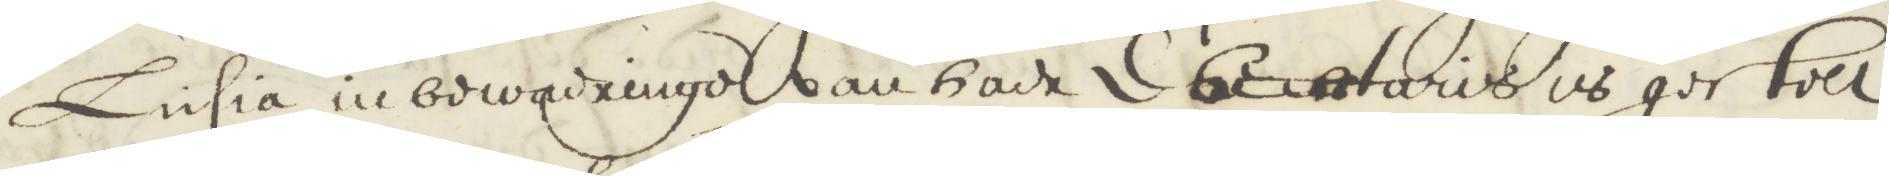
Lusia in bewaeringe van haer E secretaris is gestelt
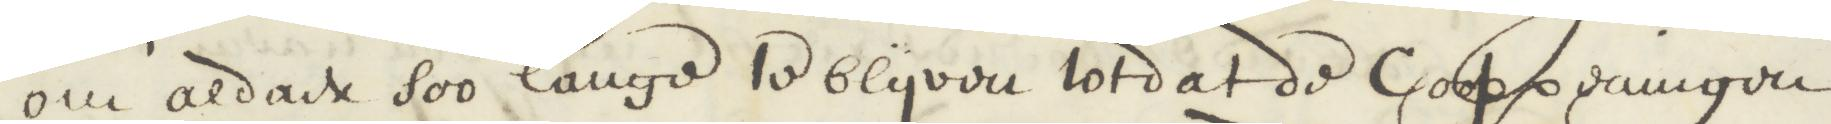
om aldaer soo lange te blijven totdat de Cooppeningen
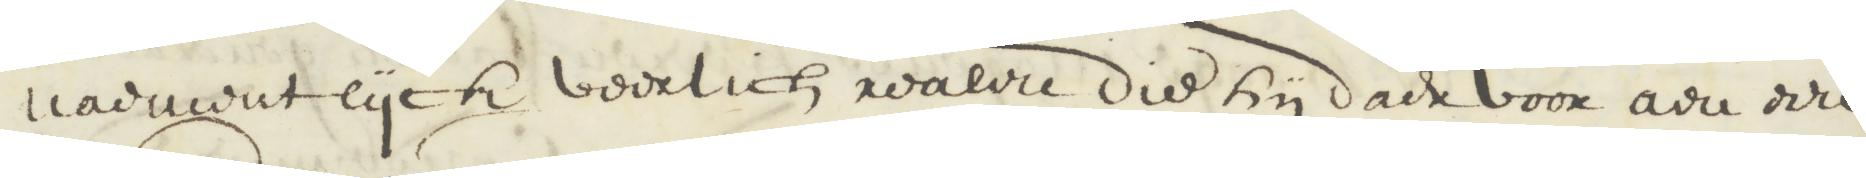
naementlijck veertich realen die hij daer voor aen een
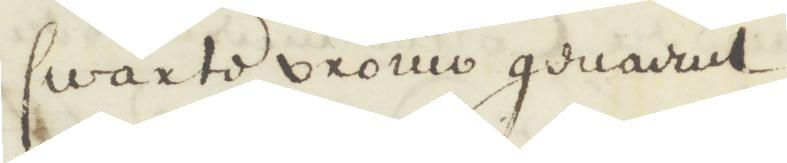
swarte vrouw genaemt
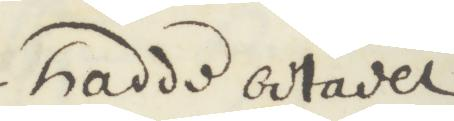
hadde betaelt
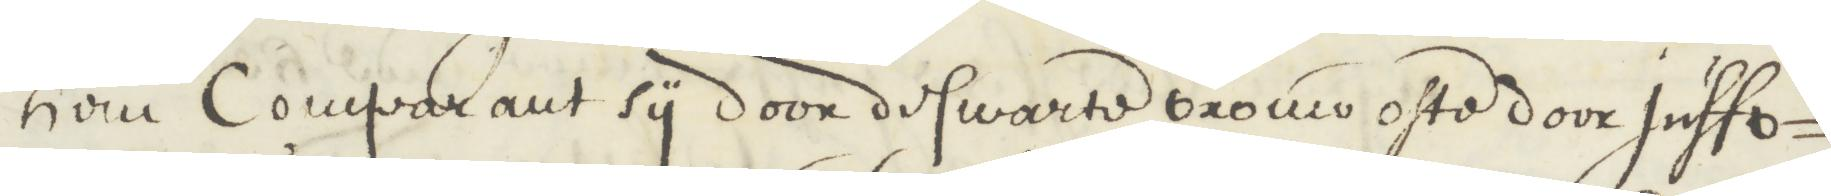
hem Comparant sij door deswarte vrouw ofte door juffv=r
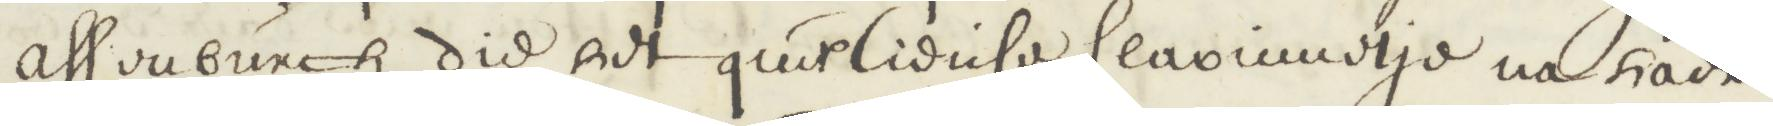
assenburch die het questieuse slavinnetje na haer
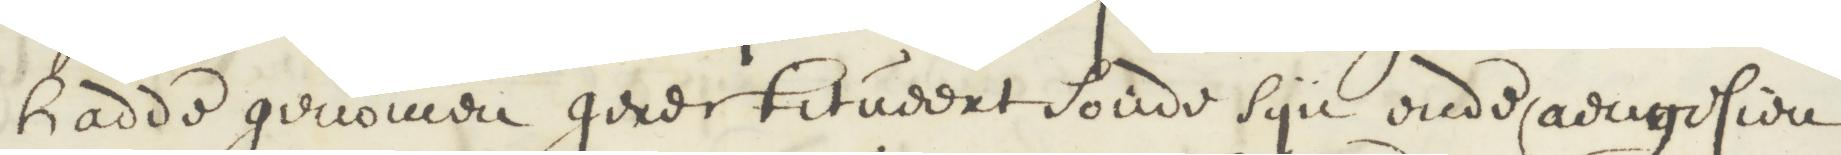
hadde genomen gerestitueert soude sijn ende aengesien
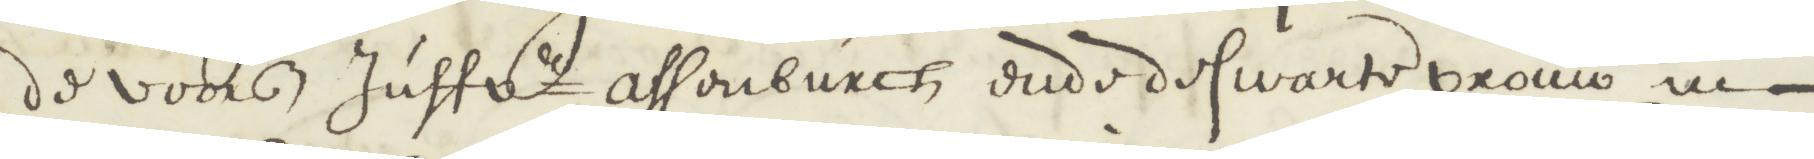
de voors Juffv=r assenburch ende deswarte vrouw in —
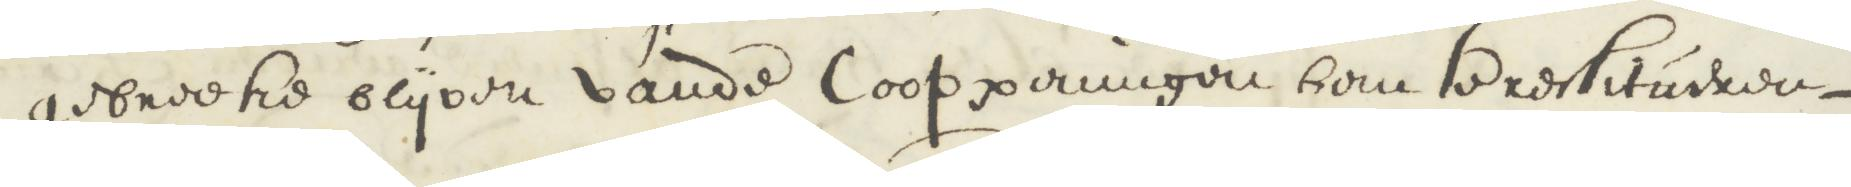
gebreeke blijven vande Cooppeningen hem te restitueren
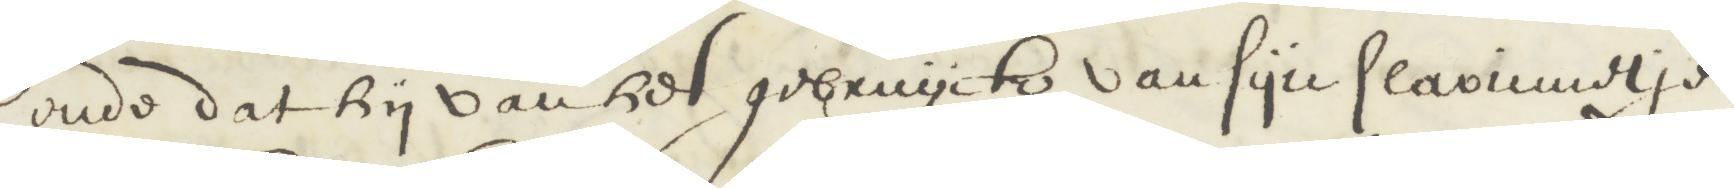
ende dat hij van het gebruijck van sijn slavinnetje —
